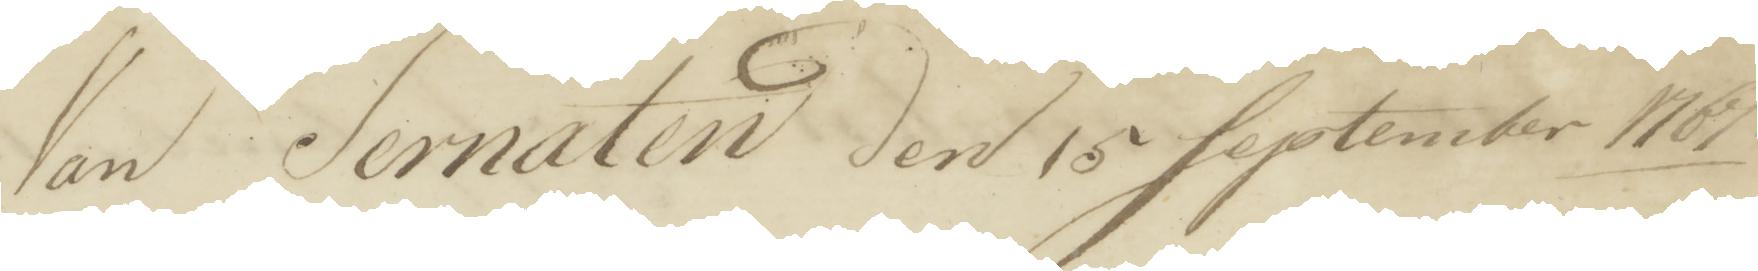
Van Ternaten den 15 September 1767
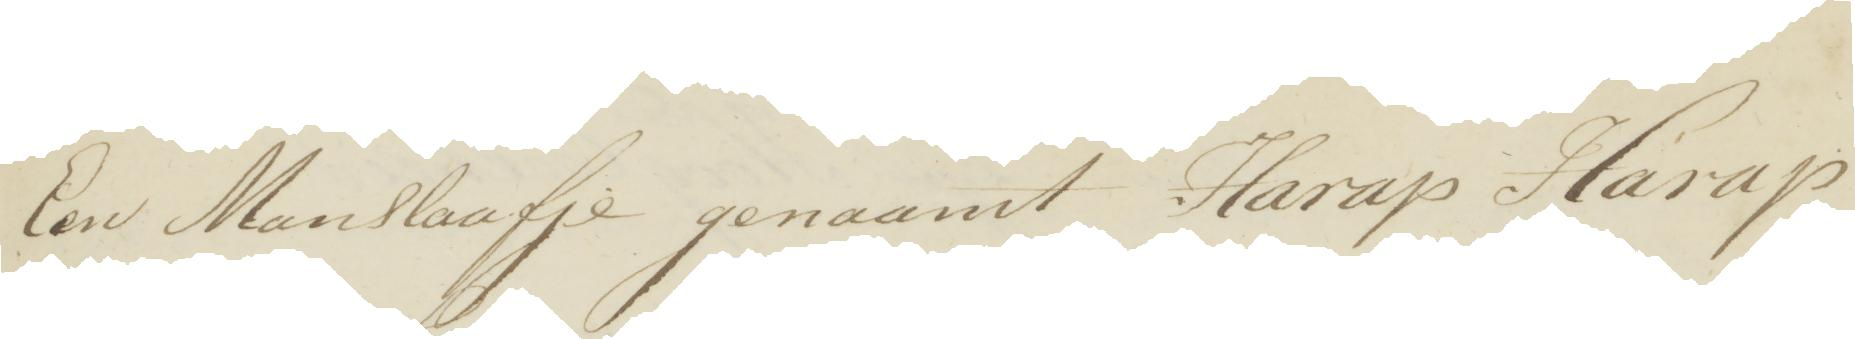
Een Manslaafje genaamt Harap Harap
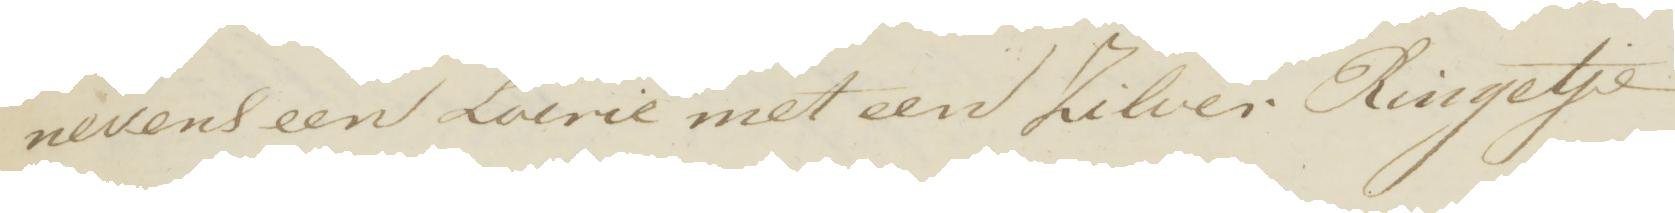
nevens een Loerie met een Zilver Ringetje
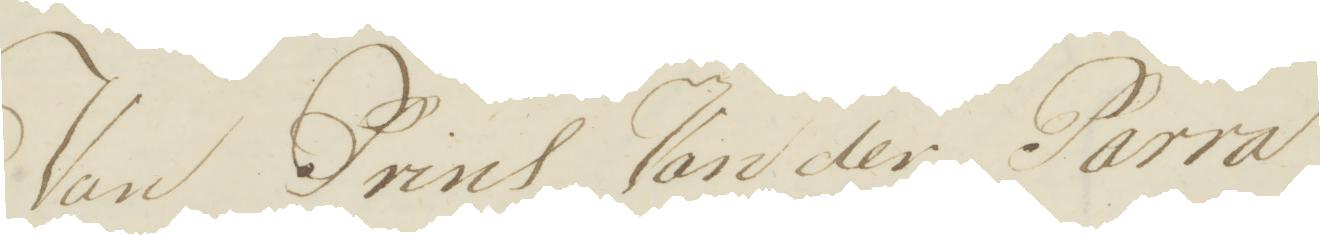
Van Prins Van der Parra
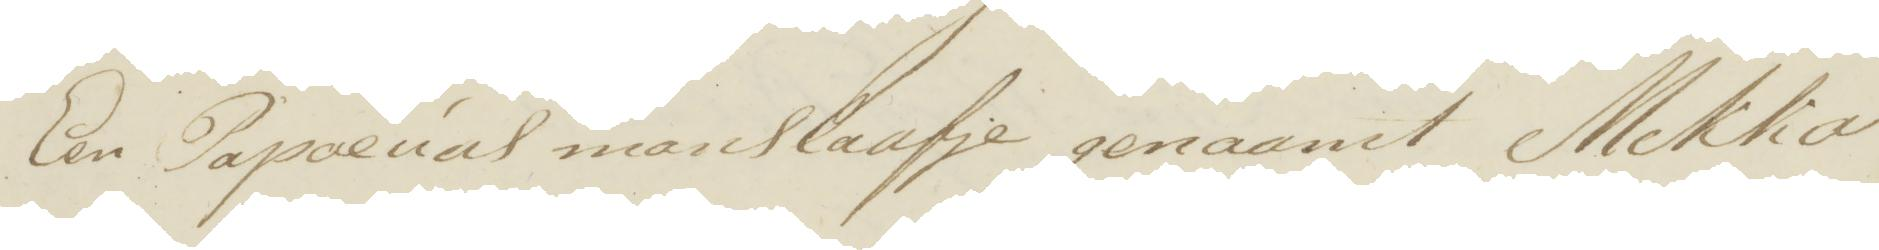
Een Papoeuans manslaafje genaamt Mekka
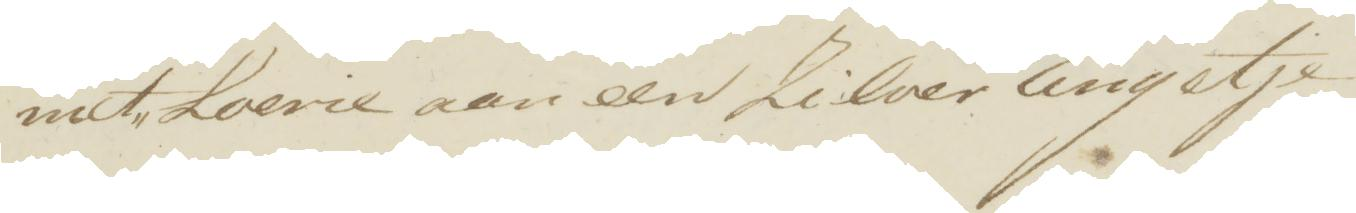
met„ Loerie aan een zilver ringetje
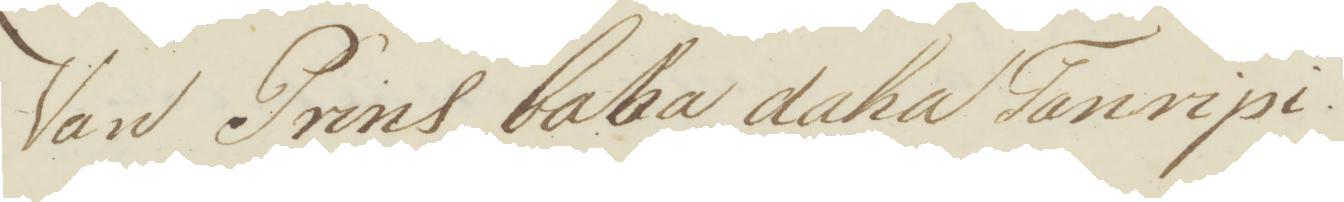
Van Prins baba daha Tanripi.
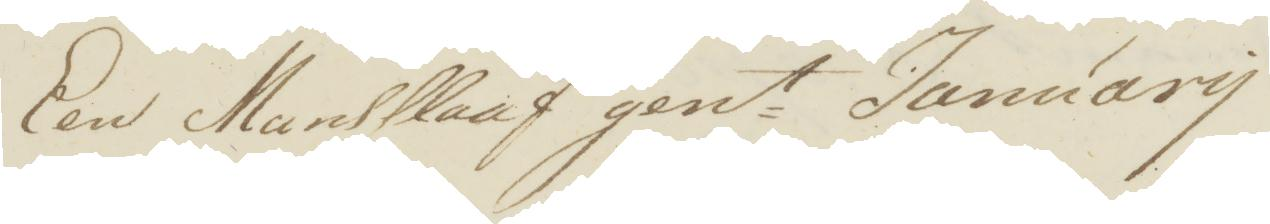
Een Mansslaaf gen:t Ianuarij
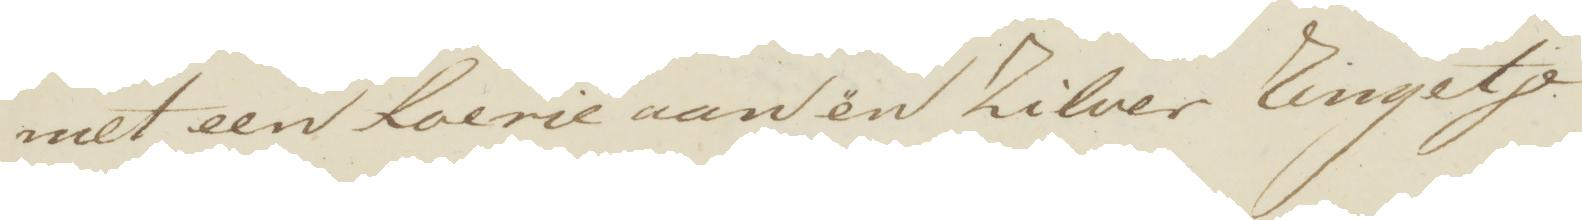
met een Loerie aan ën zilver ringetje.
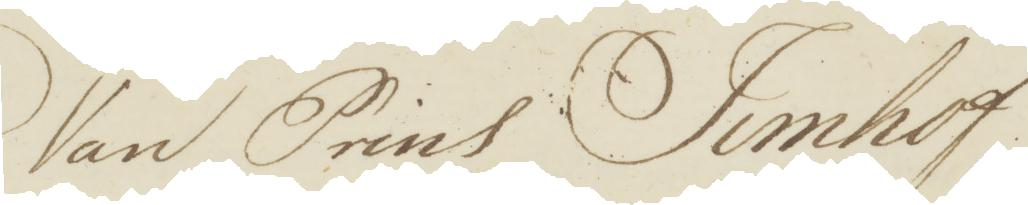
Van Prins Iimhof
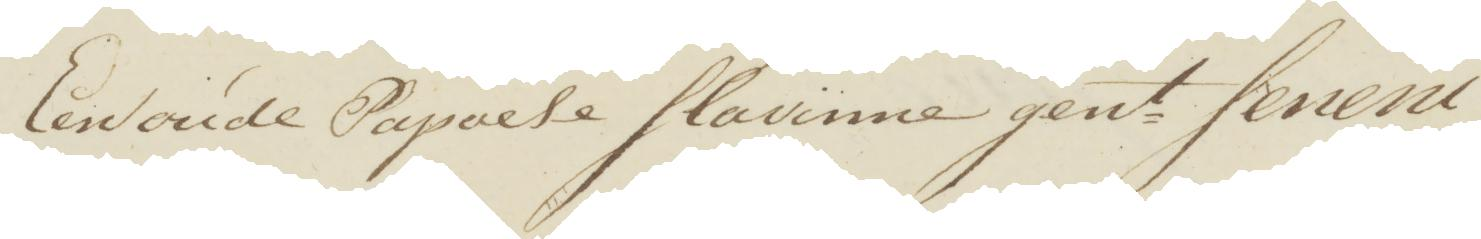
Een oude Papoese slavinne gen=t seneni
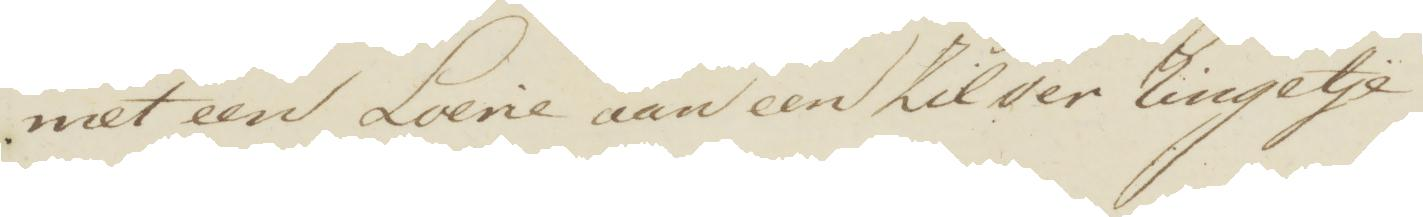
met een Loerie aan een zilver ringetje
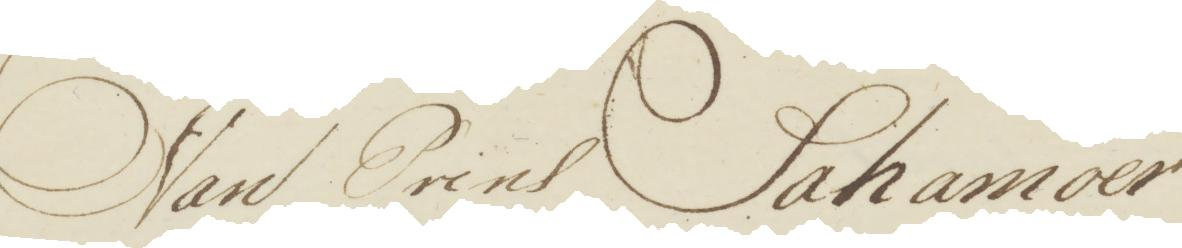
Van Prins Sahamoer
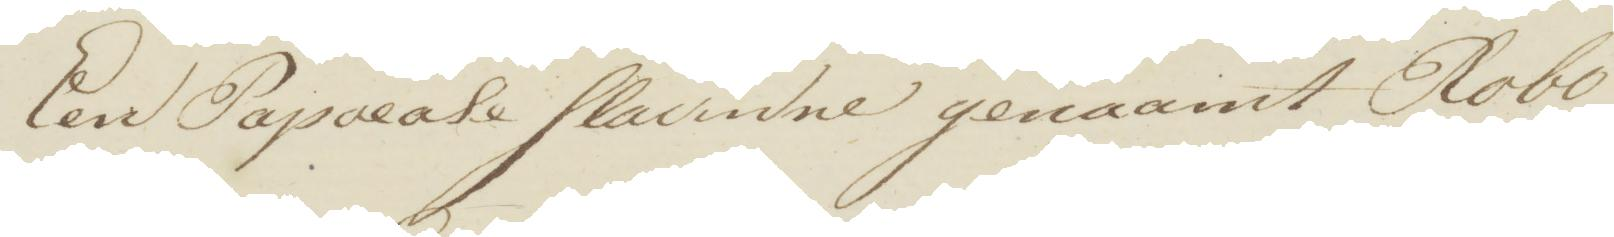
Een Papoease slavinne genaamt Robo
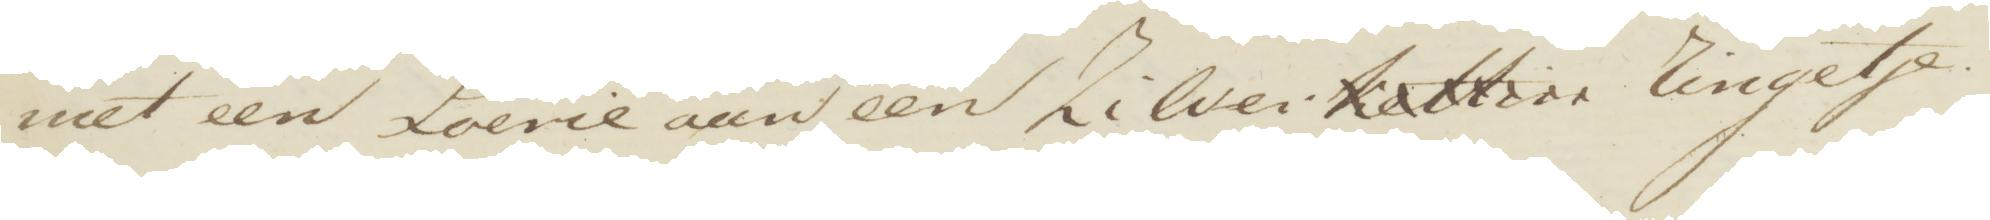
met een Loerie aan een zilver kettin ringetje.
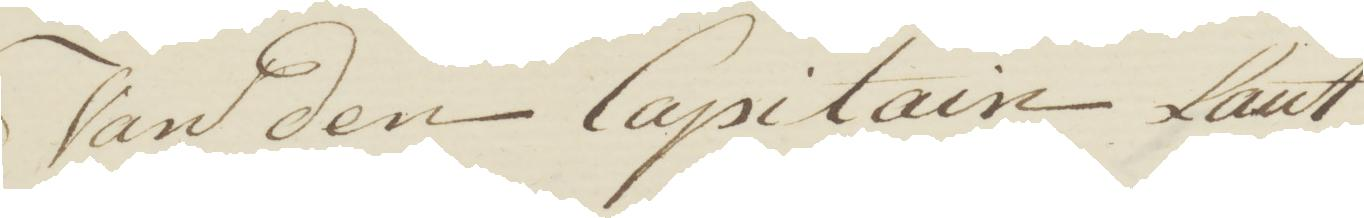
Van den Capitain Laut
